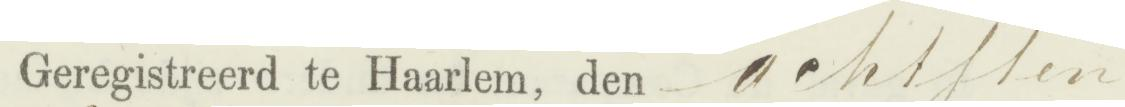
Geregistreerd te Haarlem, den Achtsten
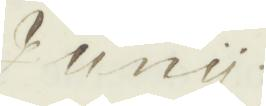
Junij.
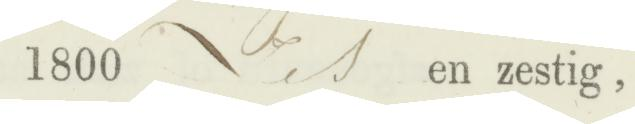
1800 Zes en zestig,
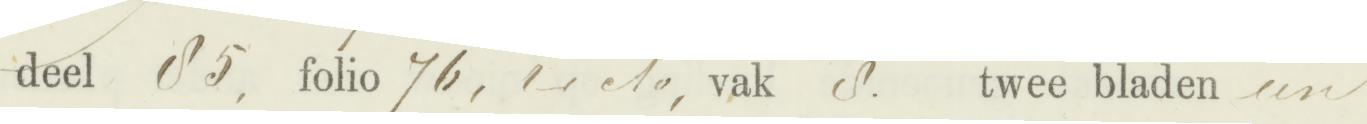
deel 85, folio 76, recto, vak 8. twee bladen een
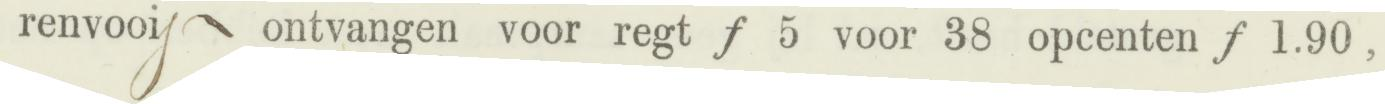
renvooij — ontvangen voor regt ƒ 5 voor 38 opcenten ƒ 1.90,
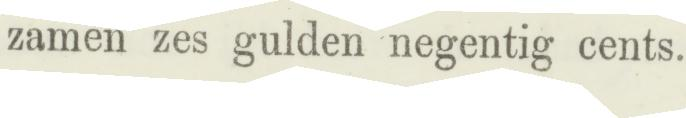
zamen zes gulden negentig cents.
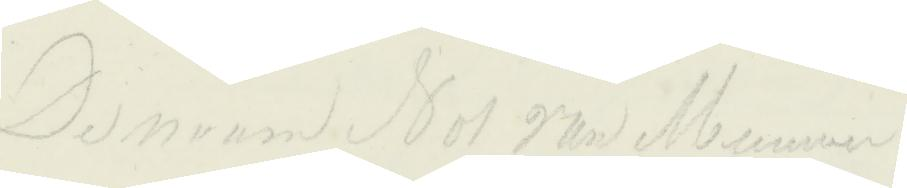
De naam Not van Meeuwen
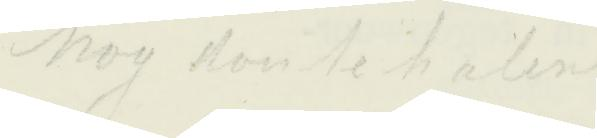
nog door te halen
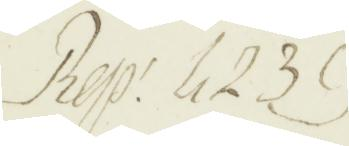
Rep:' 4239
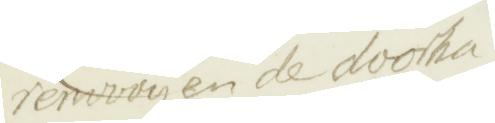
renvooy en de doorha
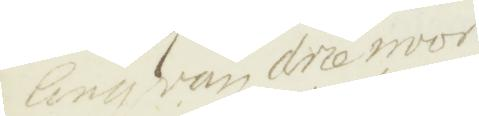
ling van drie woor
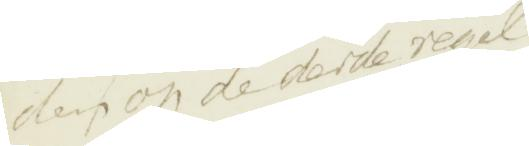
den op de derde regel
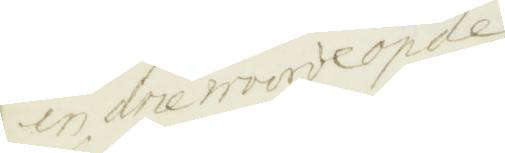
en drie woorde op de
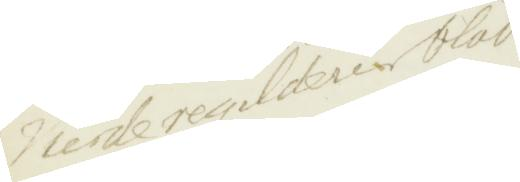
Vierde regel dezer blad
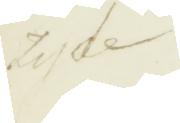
zyde
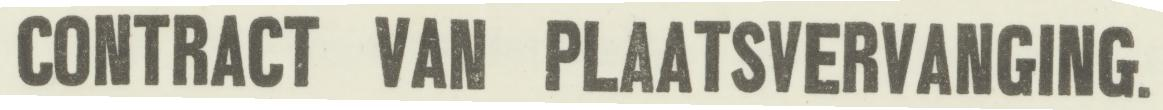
contract van plaatsvervanging
